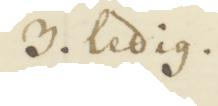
3. ledig.
